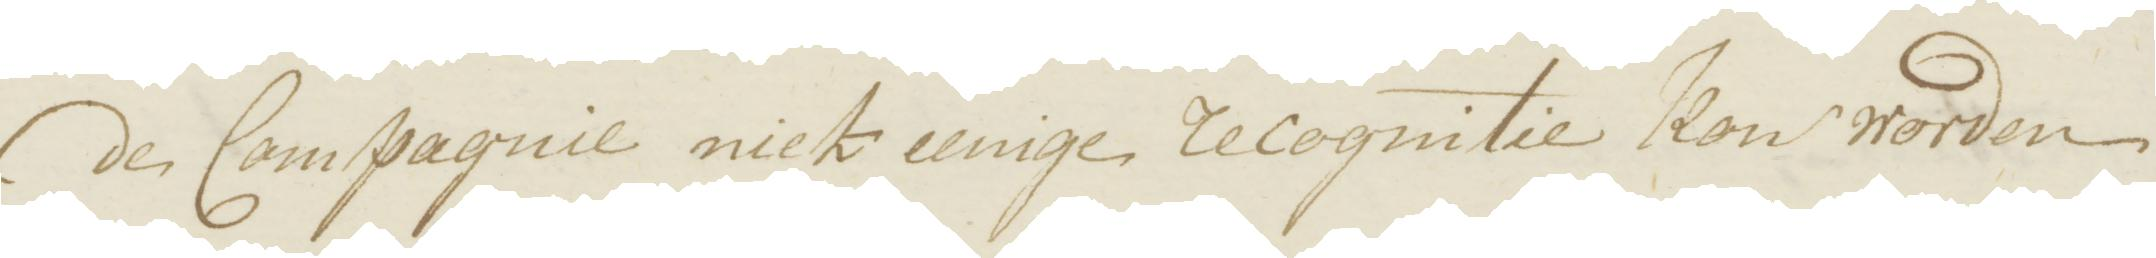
de Compagnie niet eenige recognitie kon worden
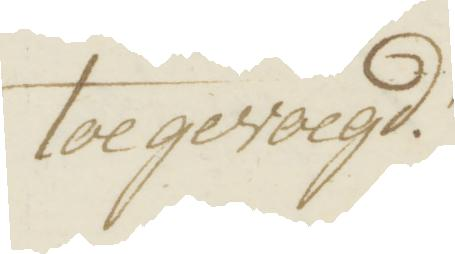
toegevoegd.
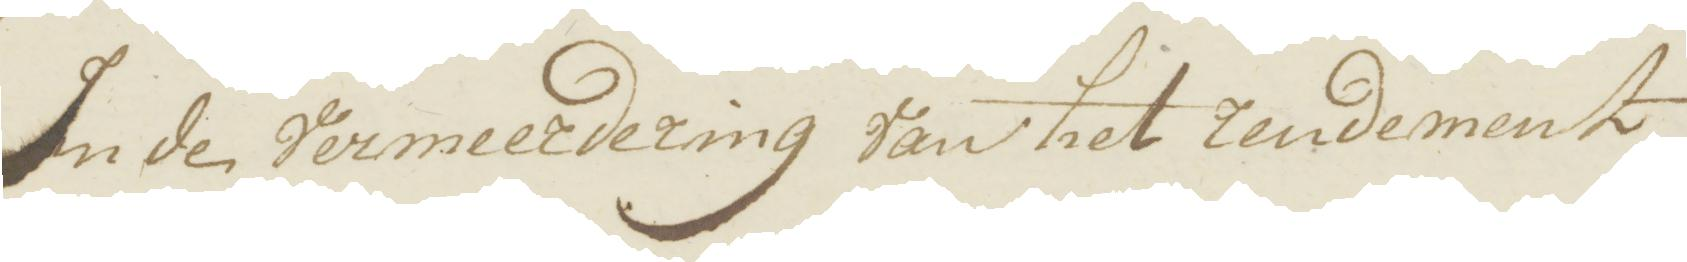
In de vermeerdering van het rendement
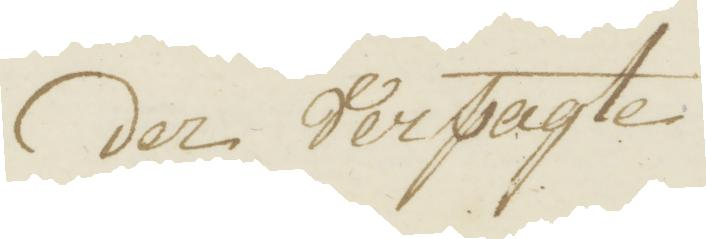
der verpagte
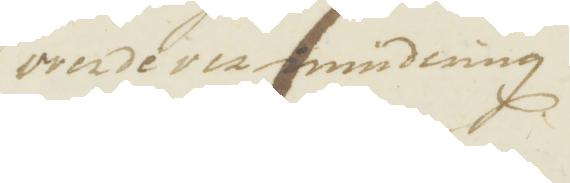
over de vermindering
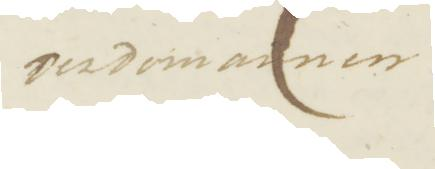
der domainen
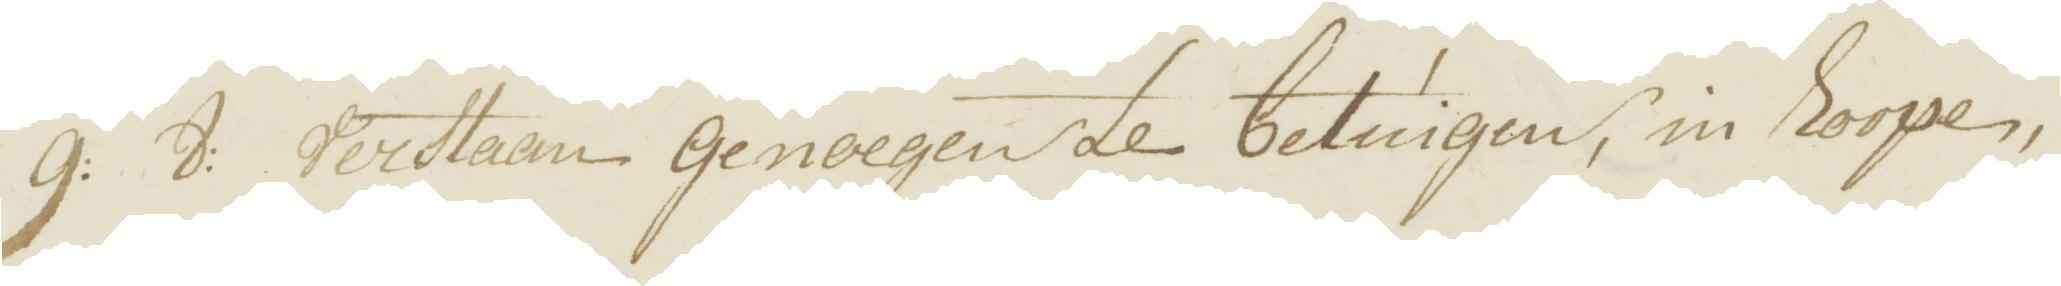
9: 8: verstaan genoegen te betuigen, in hoope,
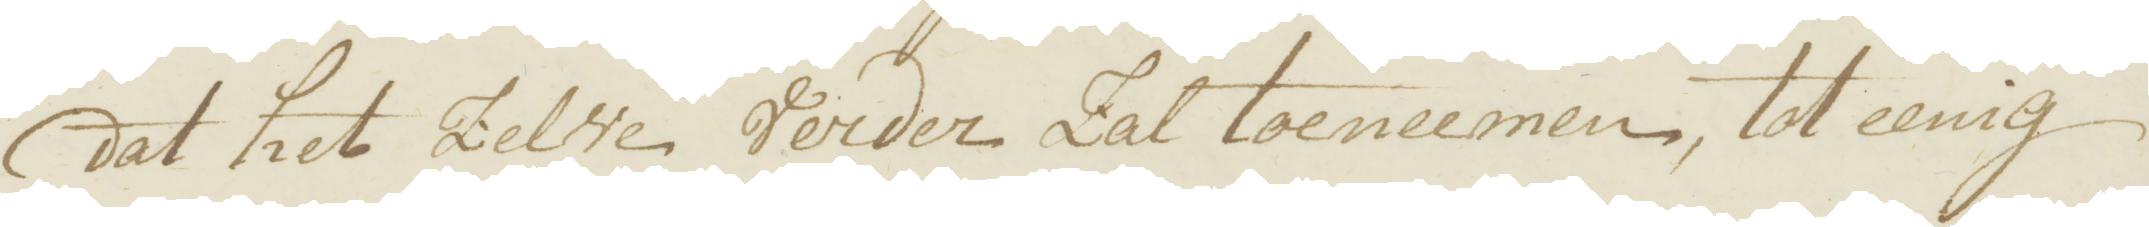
dat het zelve verder zal toeneemen, tot eenig
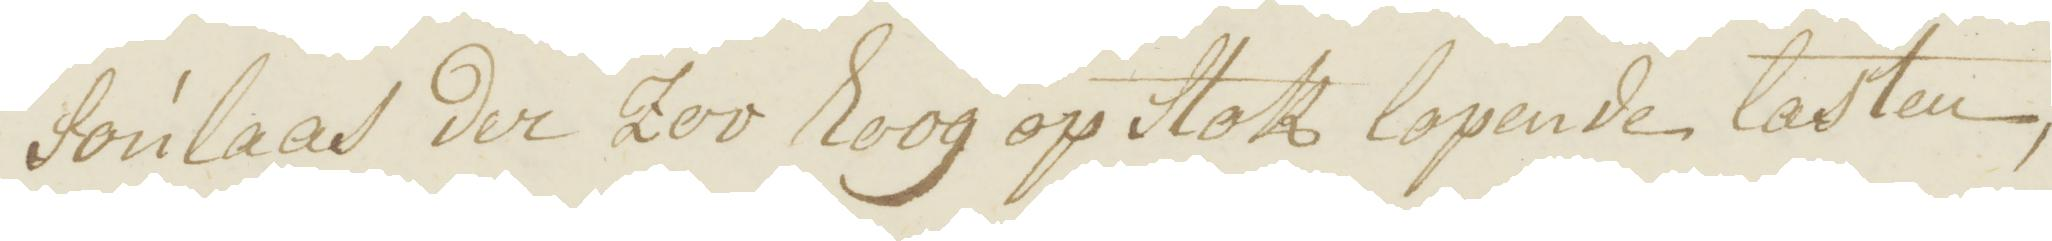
soulaas der zoo hoog op stok lopende lasten,
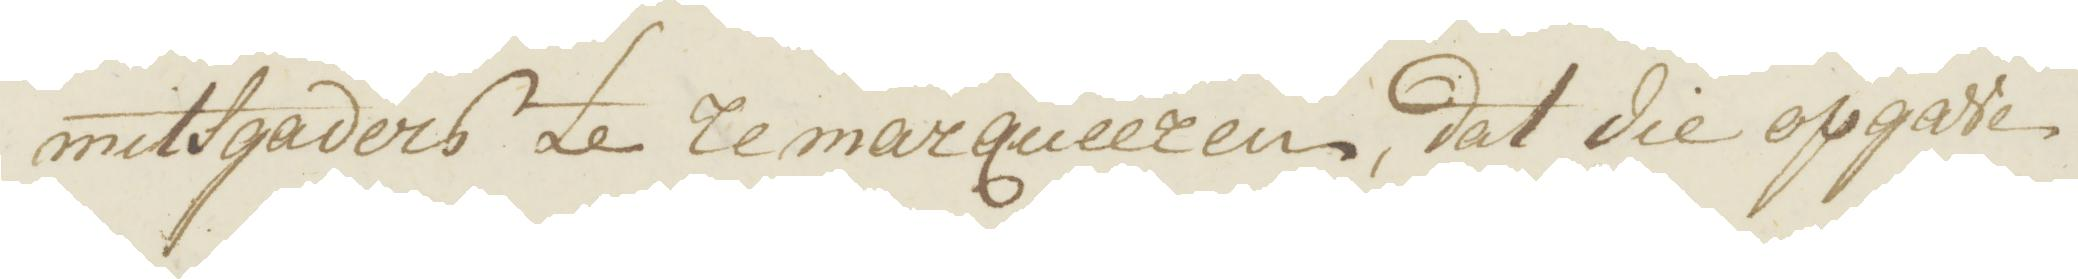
mitsgaders te remarqueeren, dat die opgave
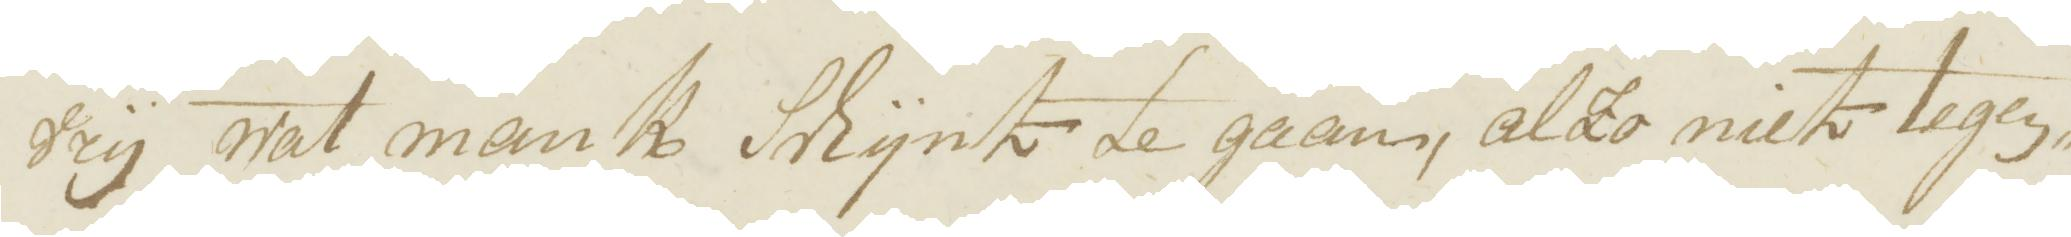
vrij wat mank schijnt te gaan, alzo niet tegen„
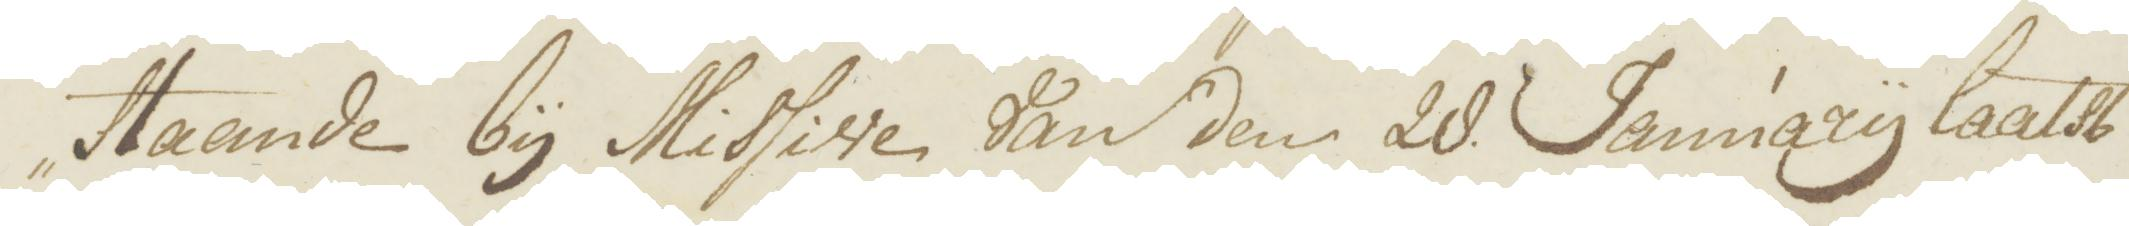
„staande bij Missive van den 28. Januarij laatst
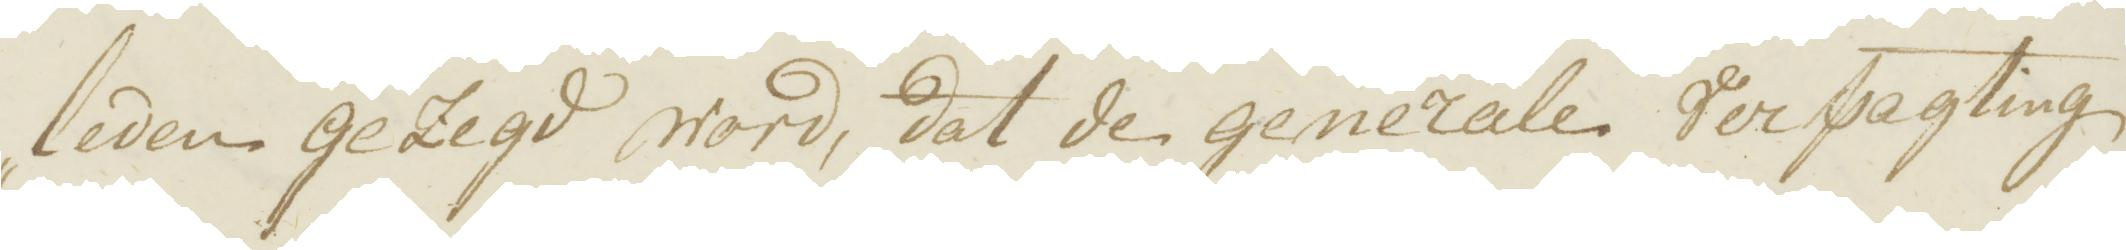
„leden gezegd word, dat de generale verpagting
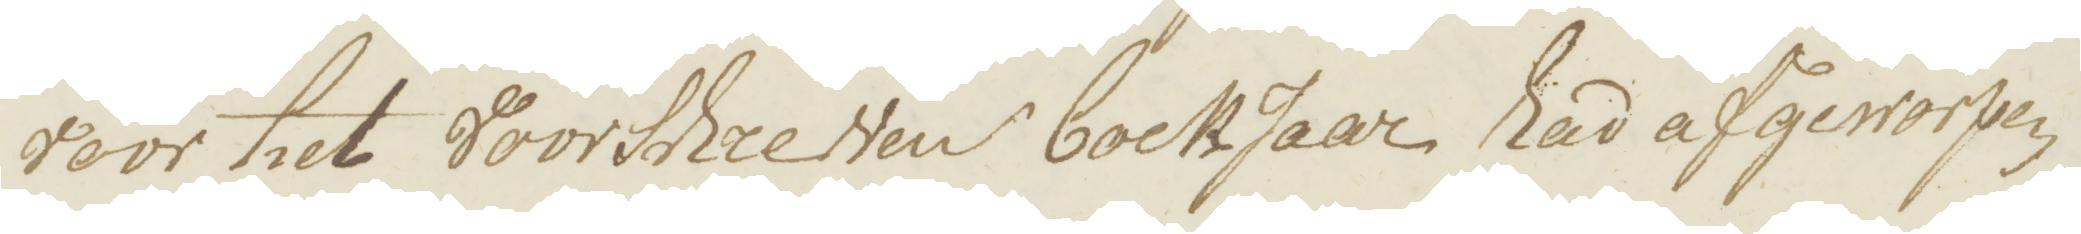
voor het voorschreven boekjaar had afgeworpen
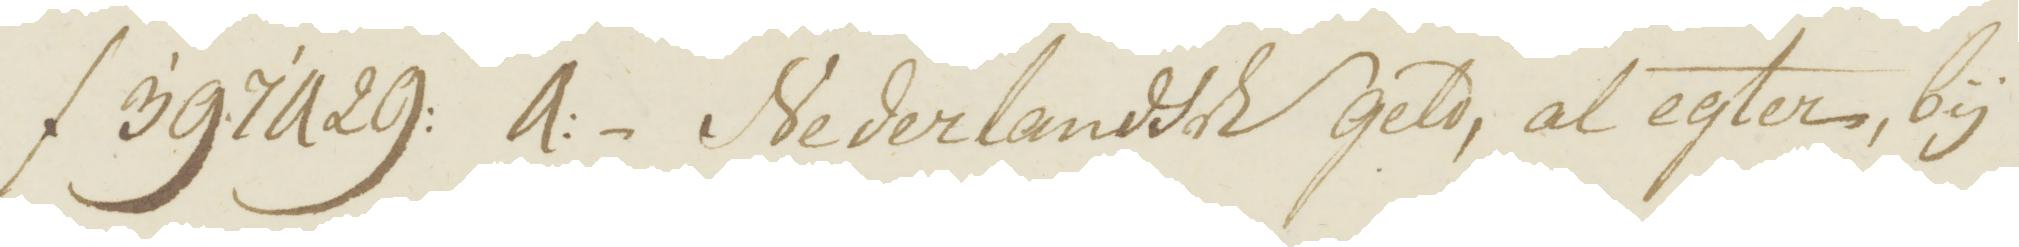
ƒ 3'97'429: 4: – Nederlandsch geld, al egter, bij
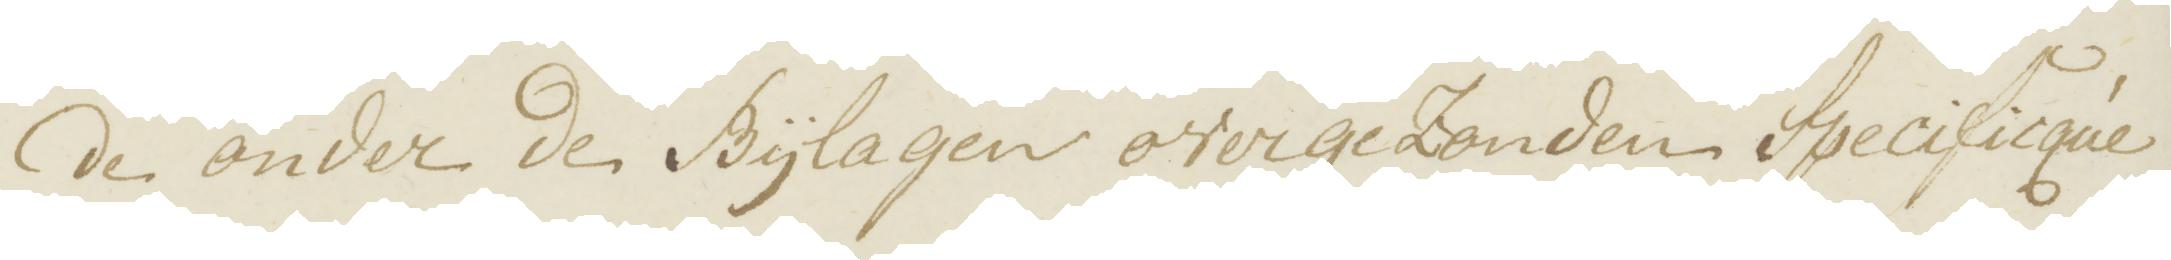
de onder de Bijlagen overgezonden specificque
